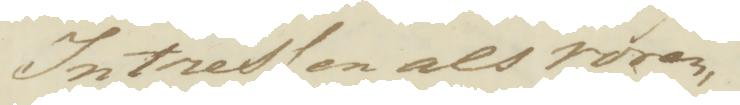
Intressen als voren,
